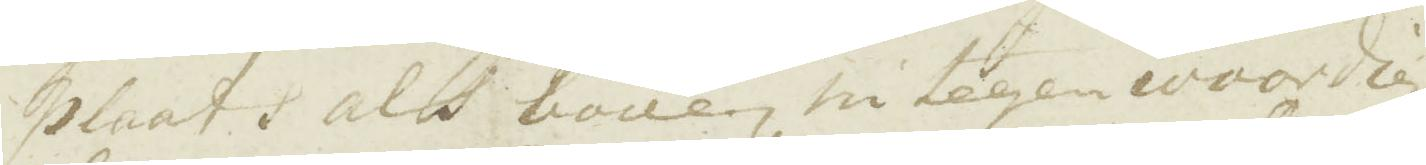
plaats als boven in tegenwoordig
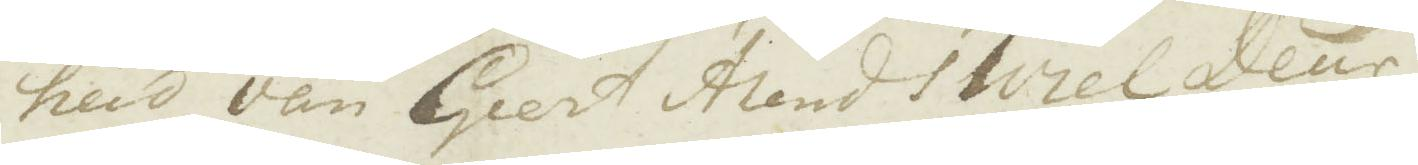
heid van Geert Arends Wiel Deur:
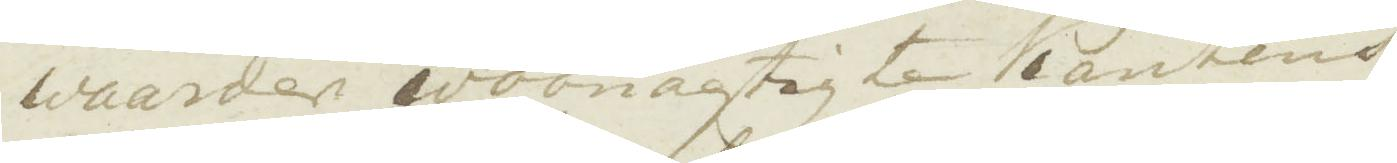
waarder woonagtig te Kantens
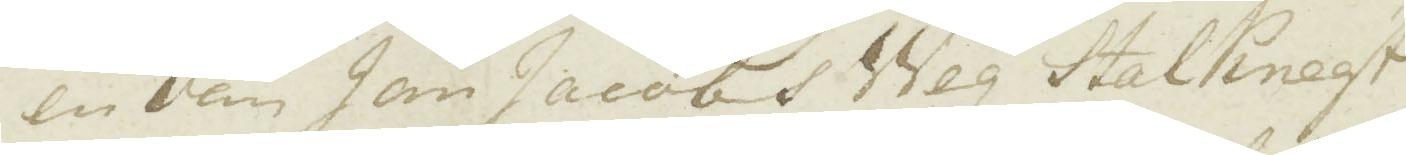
en van Jan Jacobs Weg Stalknegt
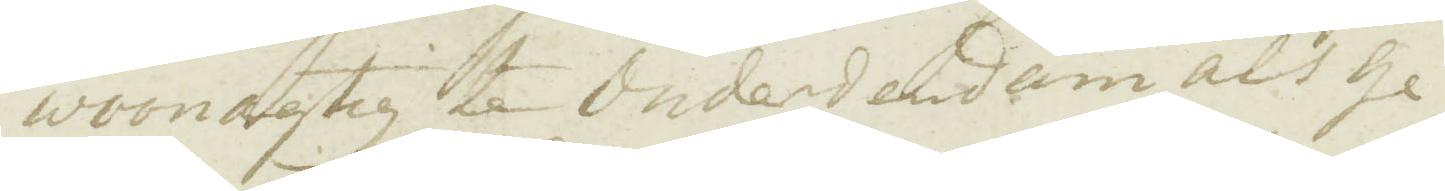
woonagtig te onderdendam als ge
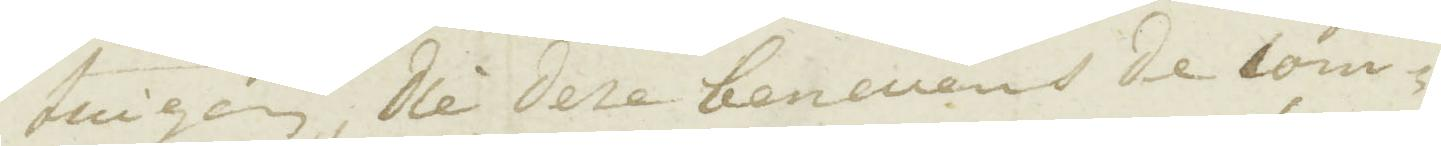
tuigen die deze benevens de com„
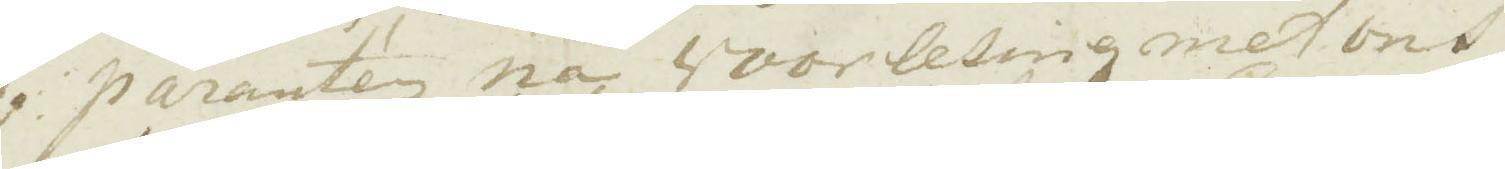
„paranten na voorlezing met ons
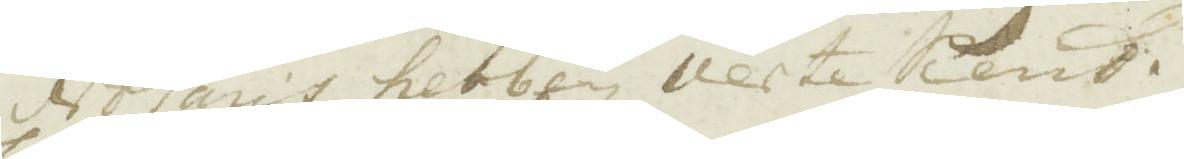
Notaris hebben vertekend:
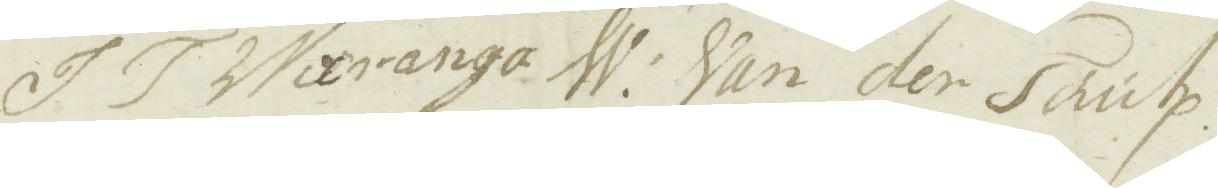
J J Wieranga W: Van der Schup
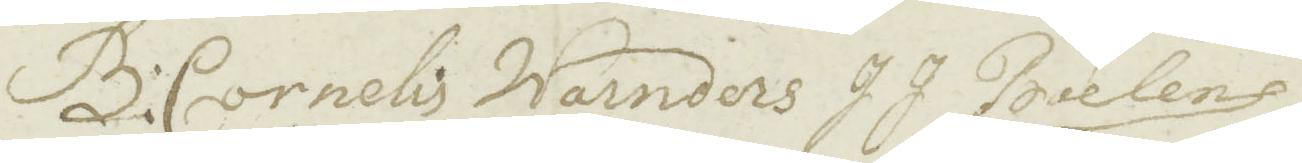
B: Cornelis Warnders J J Boelens
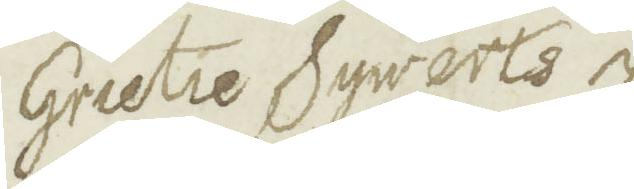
Grietie Sywerts
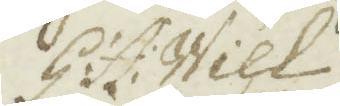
G: A: Wiel
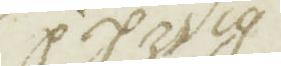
J J wig
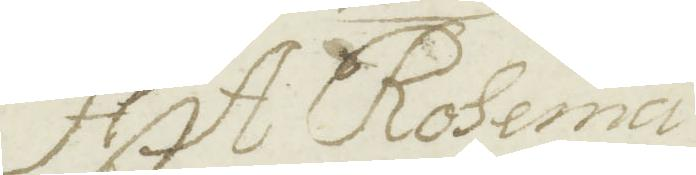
H A Rosema
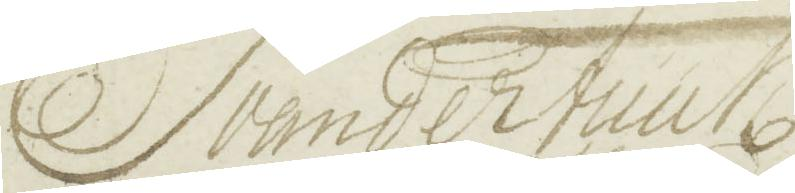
S van der tuuk
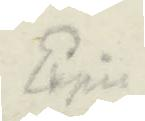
Expir
